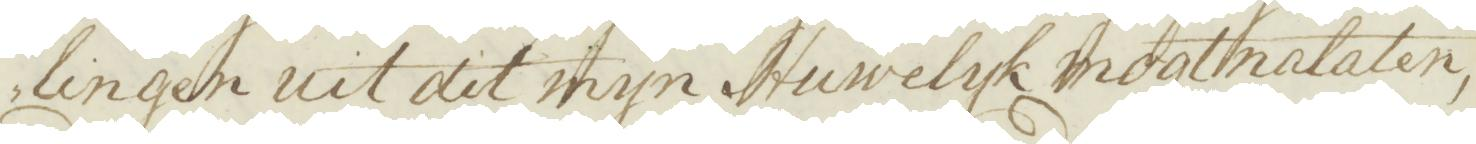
„lingen uit dit myn Huwelyk mogt nalaten,
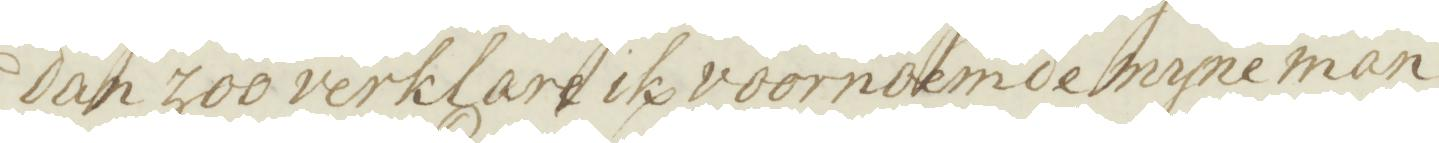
dan zoo verklare ik voornoemde myne man
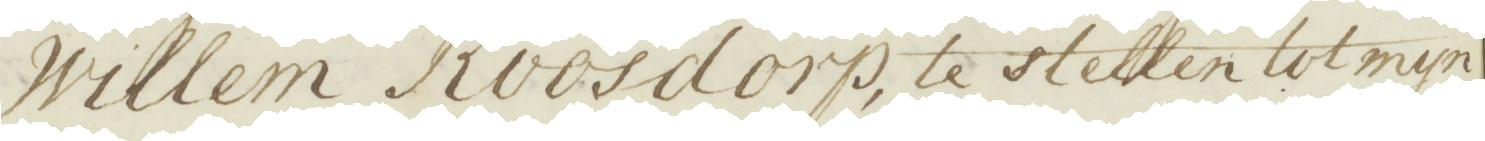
Willem Roosdorp, te stellen tot myn
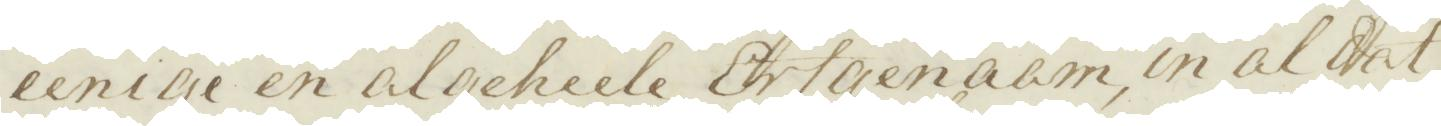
eenige en algeheele Erfgenaam, in al dat
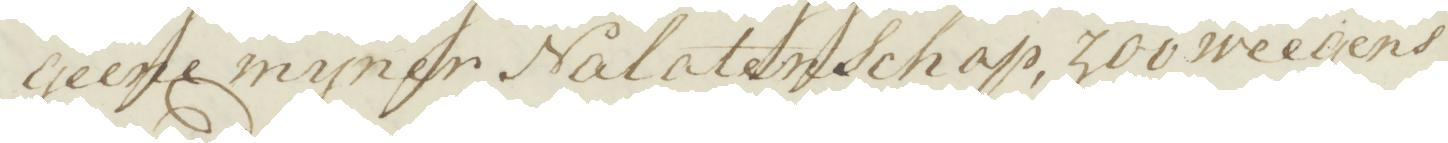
geene myner Nalatenschap, zoo weegens
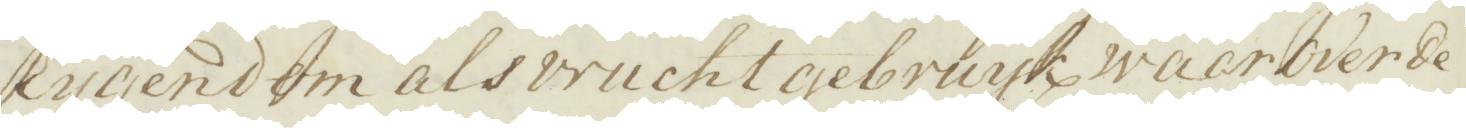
Eygendom als vruchtgebruyk waar over de
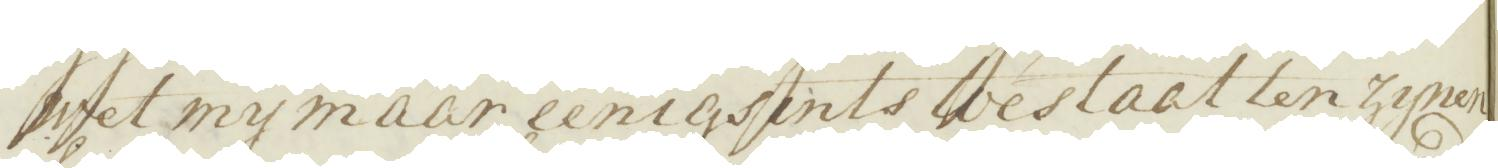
wet my maar eenigsints toestaat ten zijnen
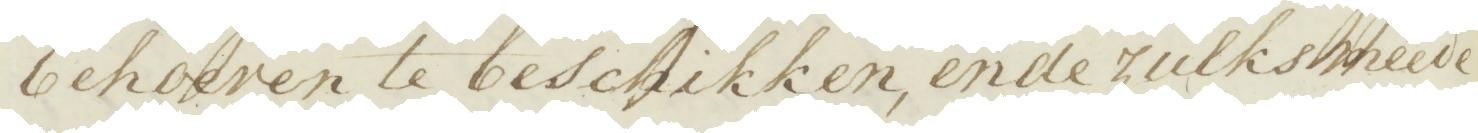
behoeven te beschikken, en de zulks meede
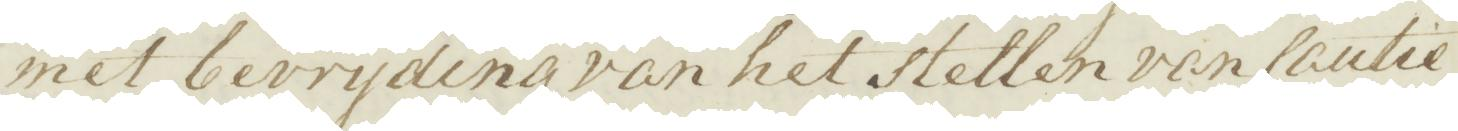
met bevryding van het stellen van Cautie
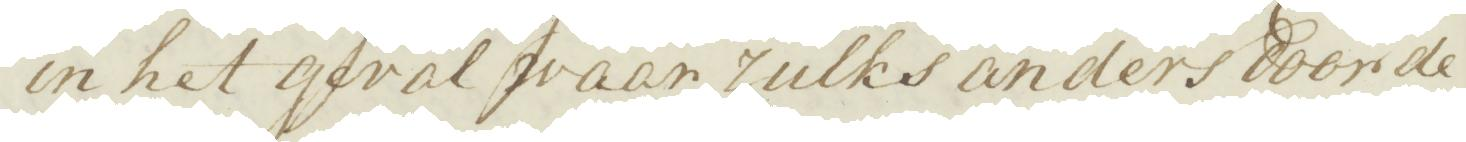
in het geval waar zulks anders door de
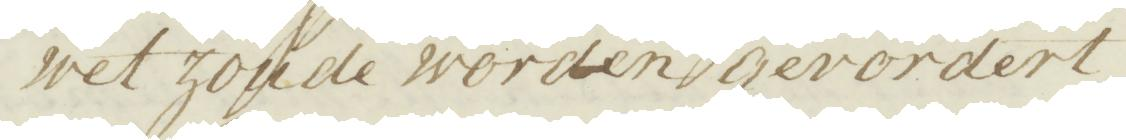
wet zoude worden gevordert
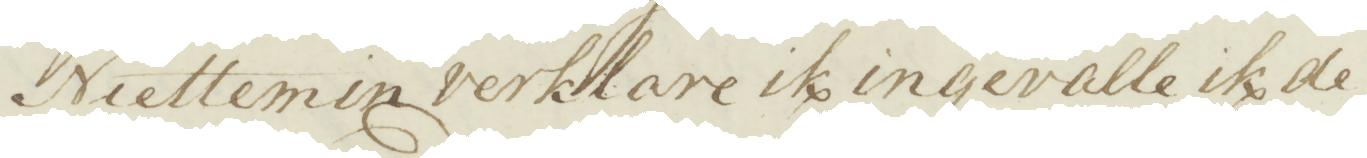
Niettemin verklare ik ingevalle ik de
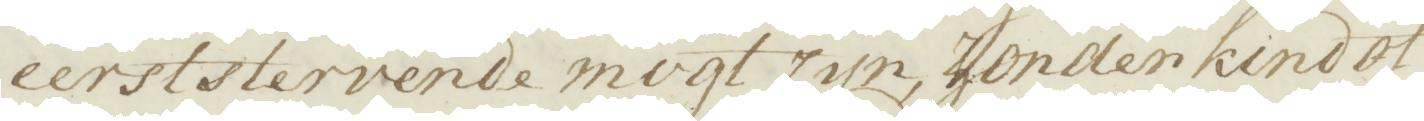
eerststervende mogt zijn, zonder kind of
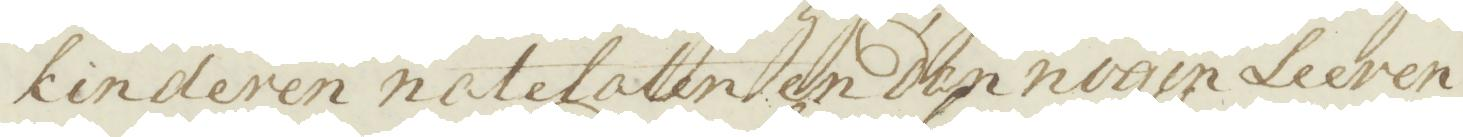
kinderen natelaten en dan nog in Leeven
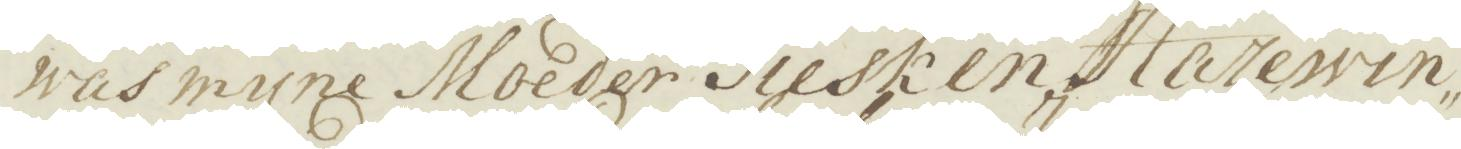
was mijne Moeder Siesken Hazewin„
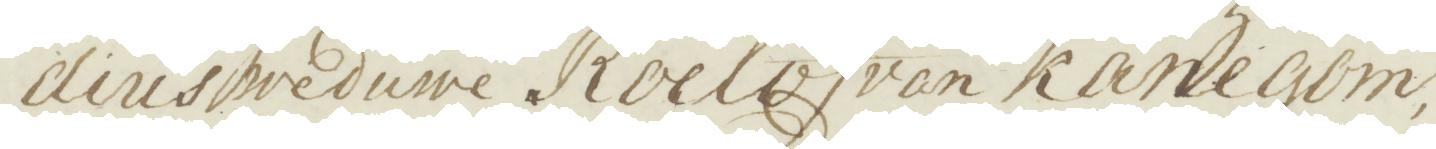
dius weduwe Roelof van Kanegom,
